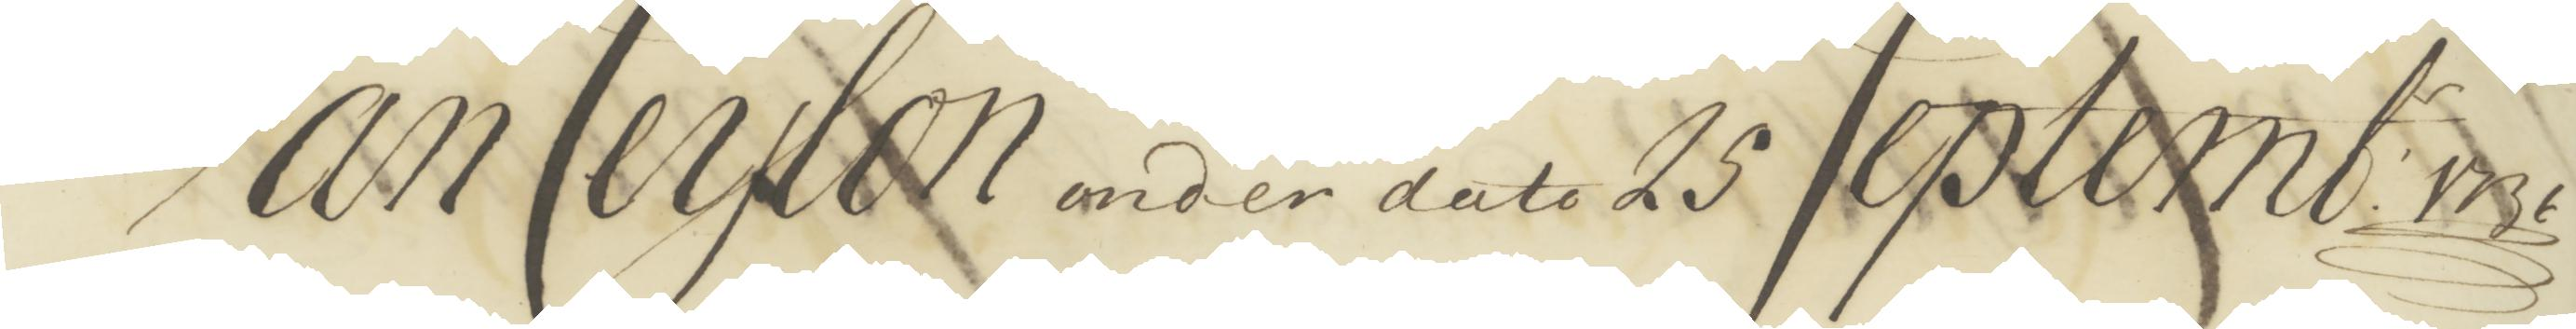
Van Ceylon onder dato 25 Septemb:r 1736
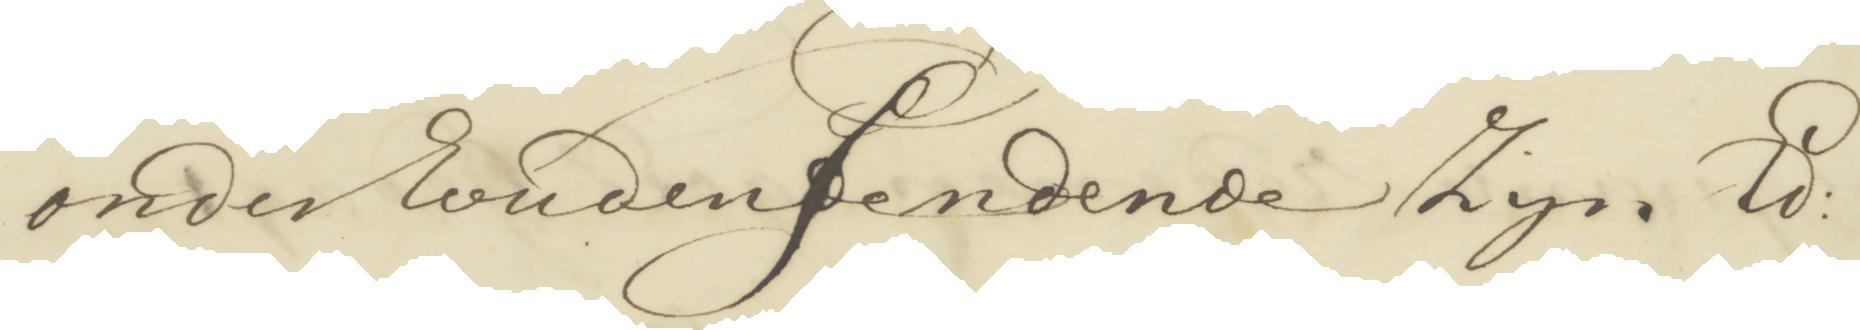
onder houdendendende zijn Ed:
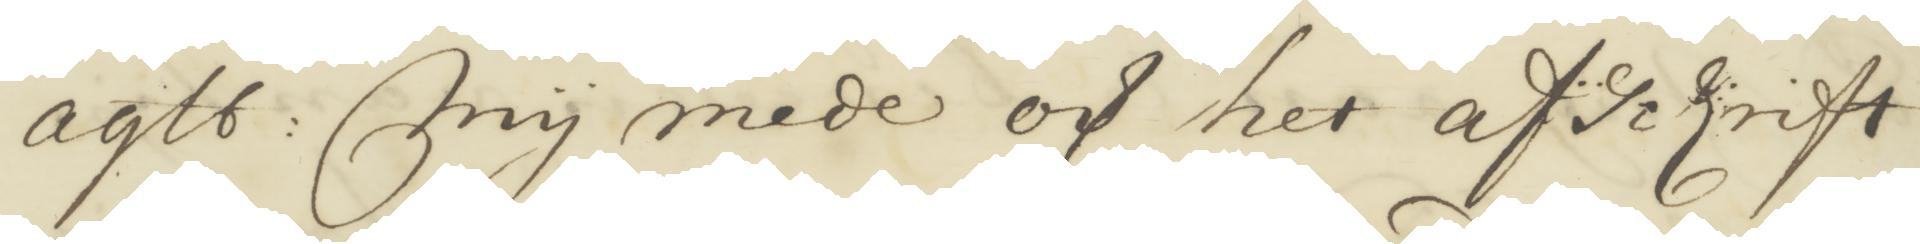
agtb: Mij mede over het afschrift
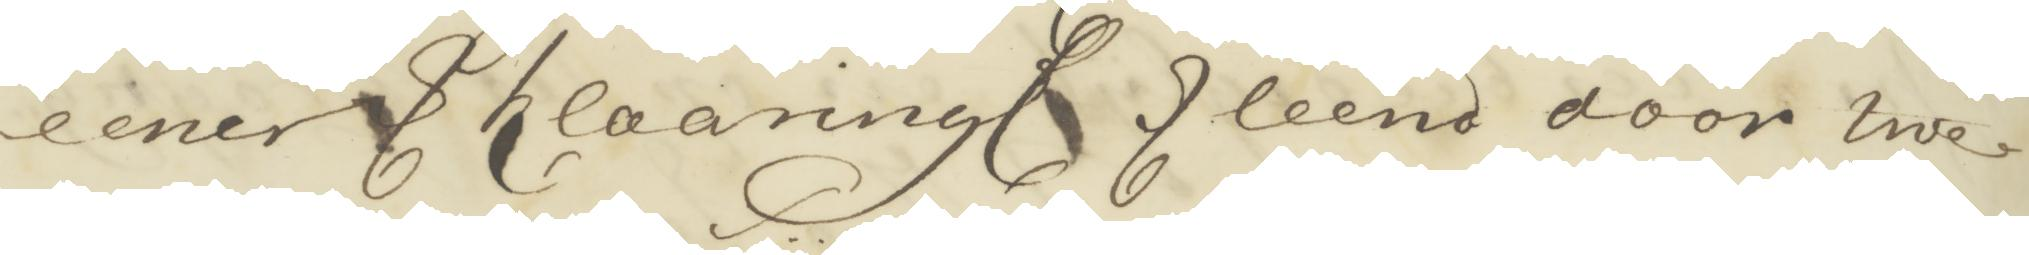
eener verklaaringh verleend door twe
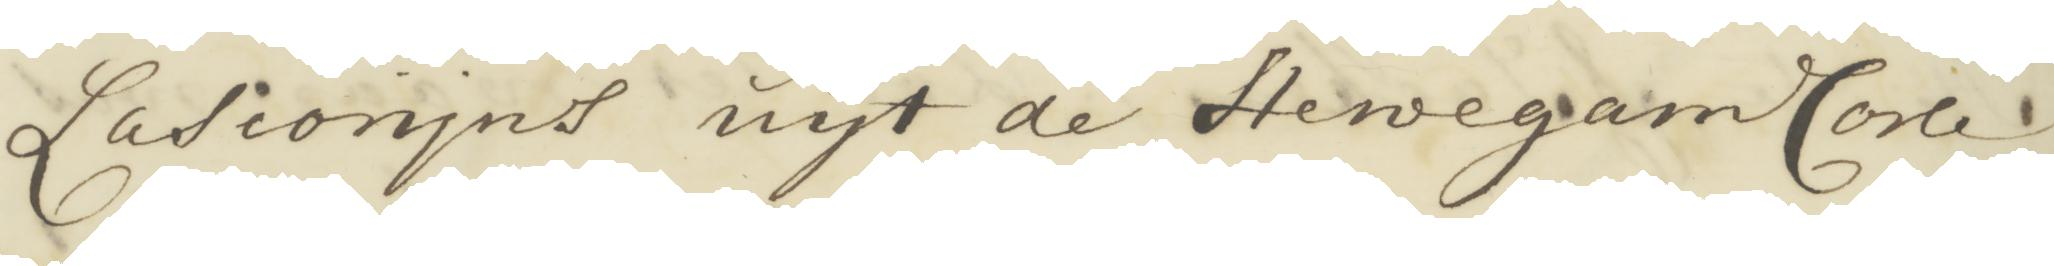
Lascorijns uijt de stewegam Corle
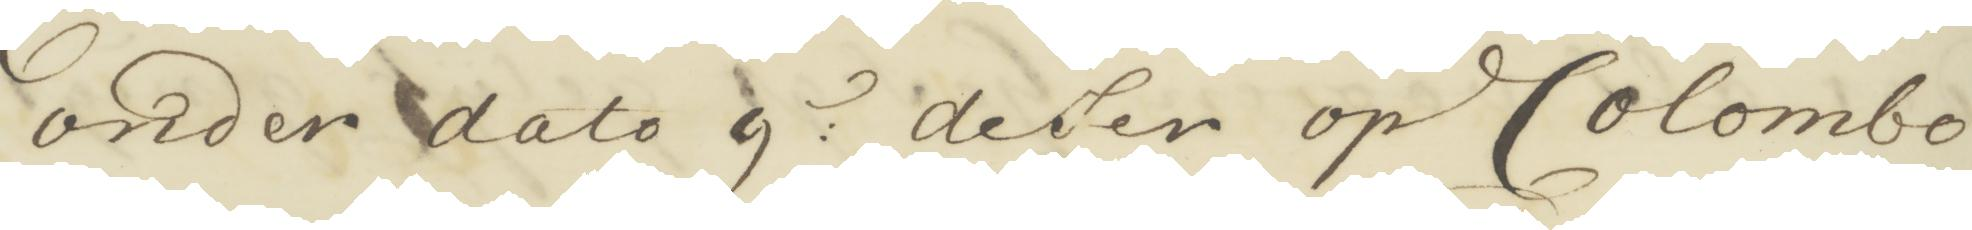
onder dato 9:e deser op Colombo
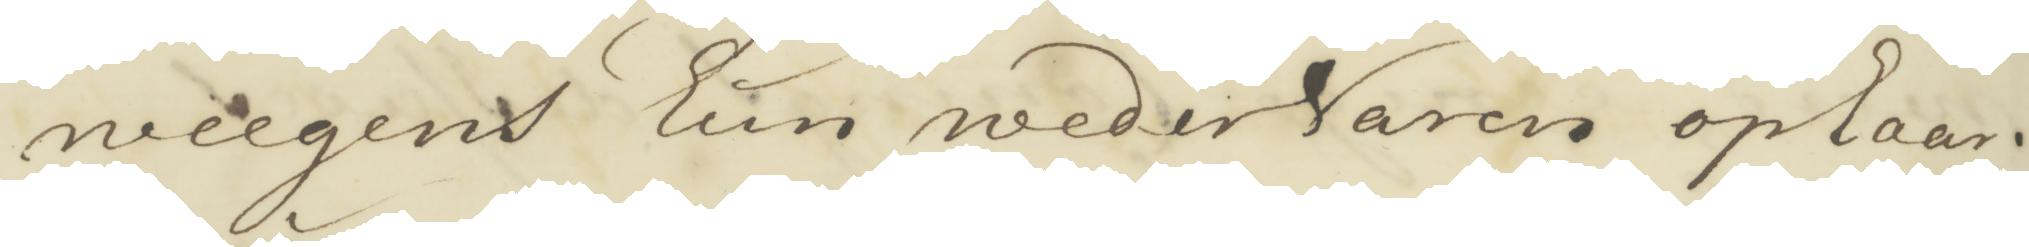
weegens hun weder varen op haar
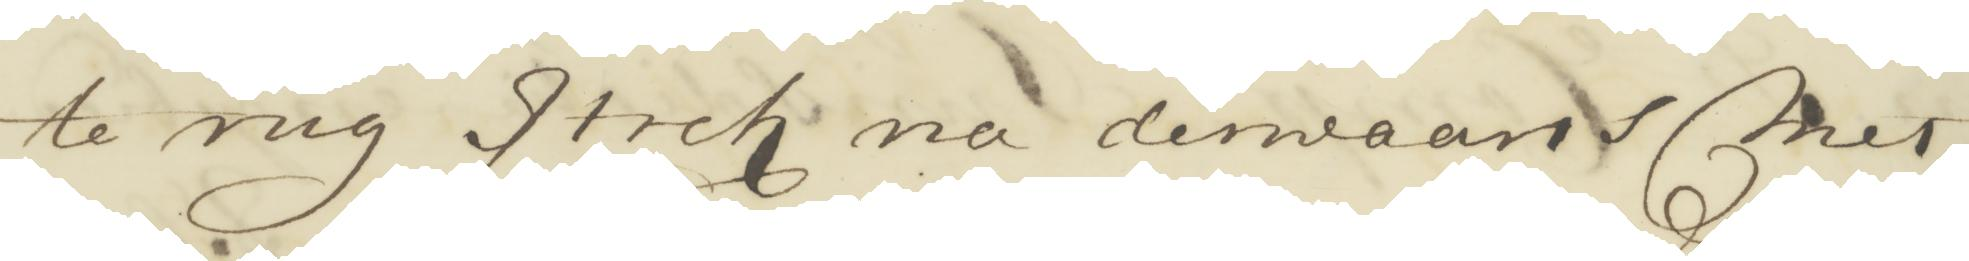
te rug vertrek na derwaarts met
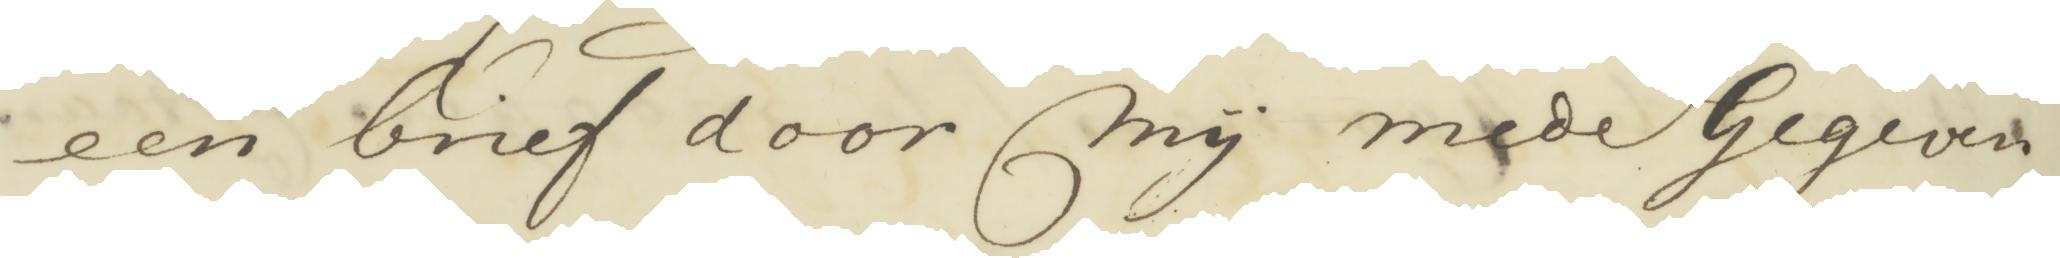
een brief door mij mede Gegeven
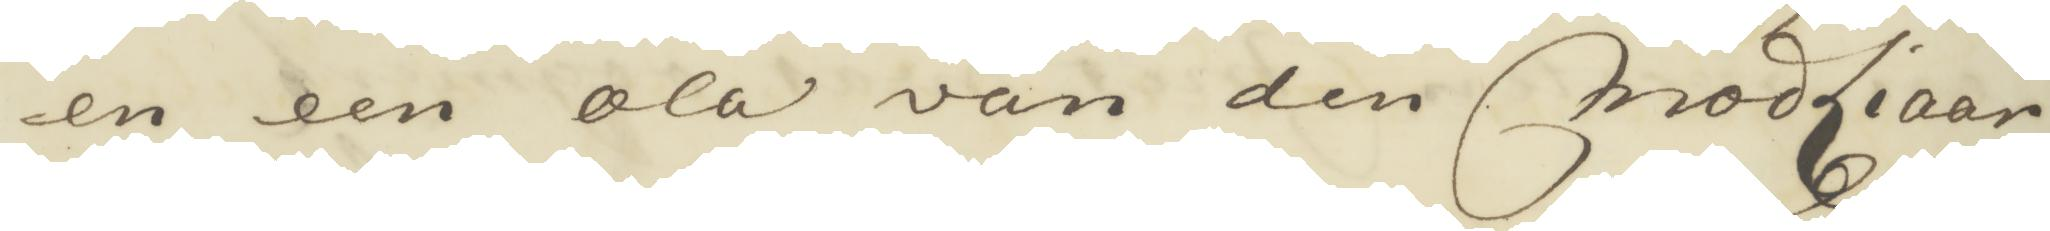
en een ola van den modliaar
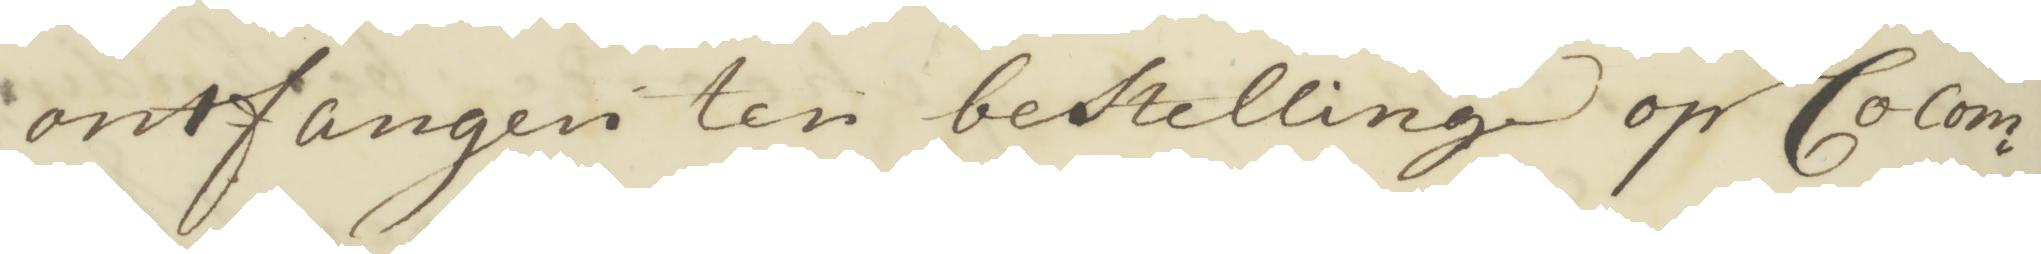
ontfangen ter bestellinge op Colom„
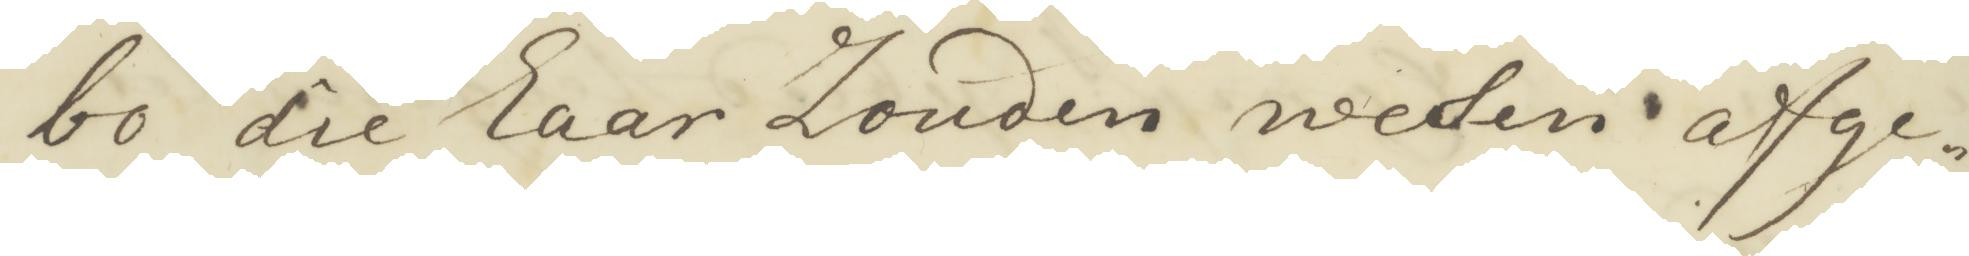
bo die haar zouden wesen afge„
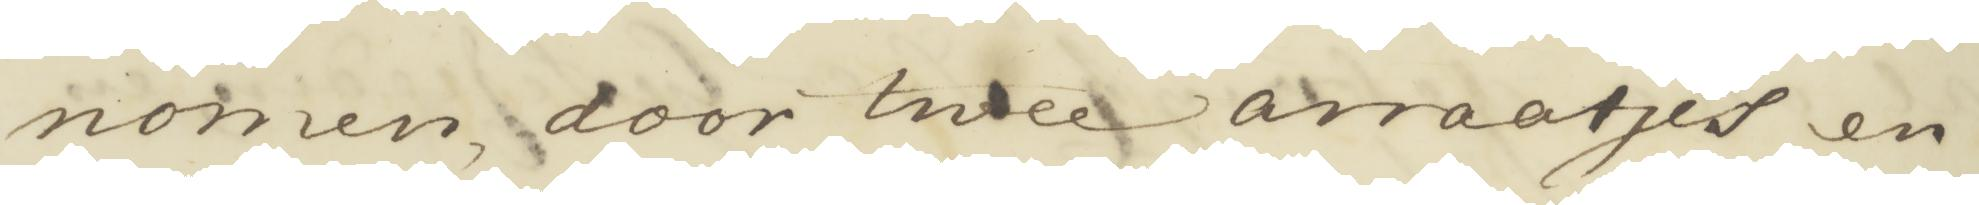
nomen, door twee arraatjes en
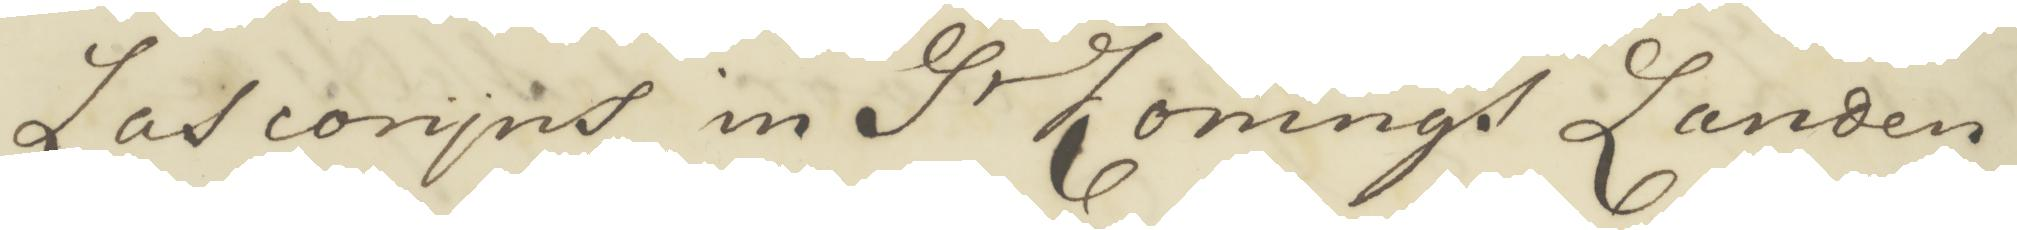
Lascorijns in S' Konings Landen
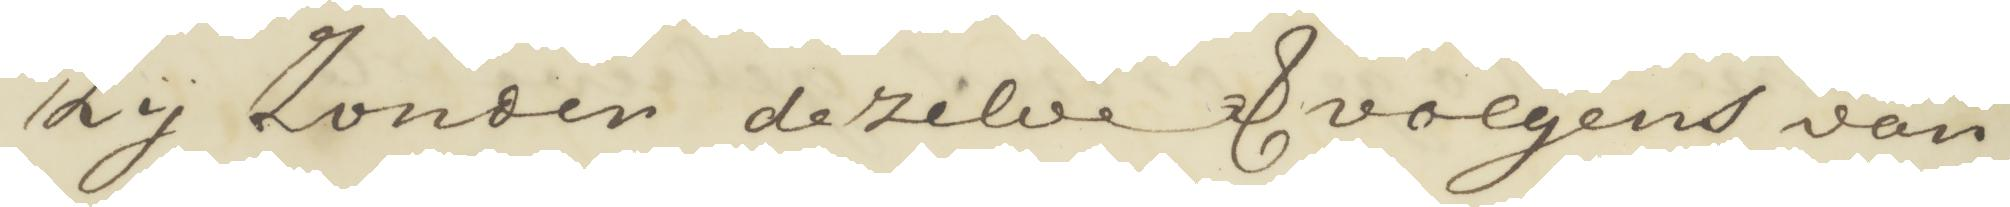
zij zonder dezelve vervolgens van
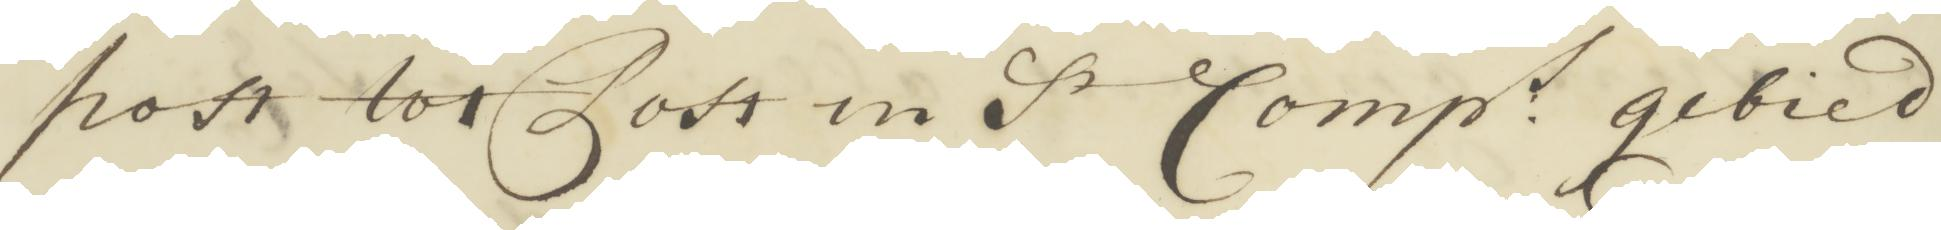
post tot Post in s' Comp:s gebied
